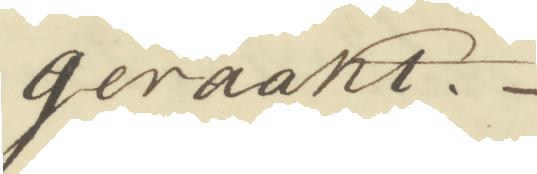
geraakt. -
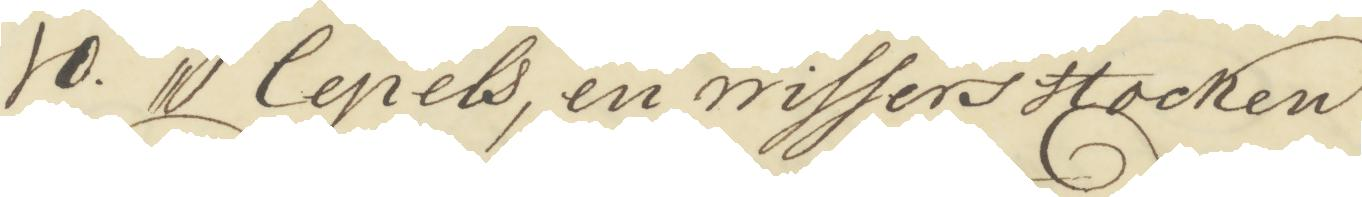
10. „ lepels, en wissers stocken
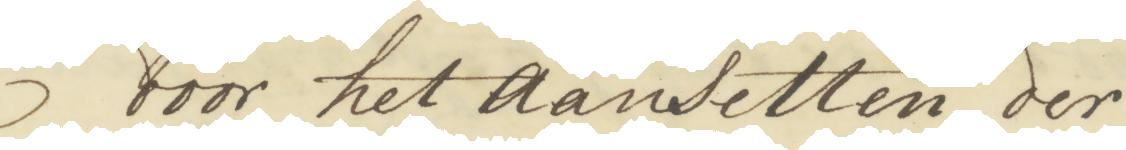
door het Aansetten der
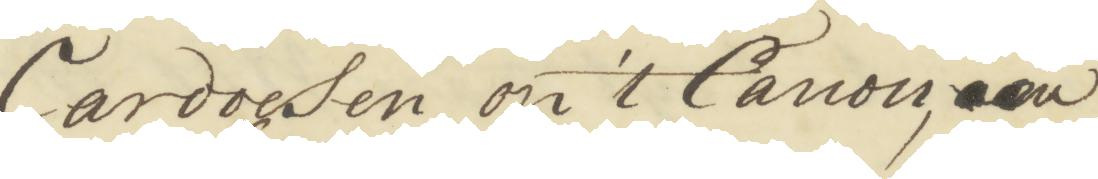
Cardoesen op ’t Canon, een
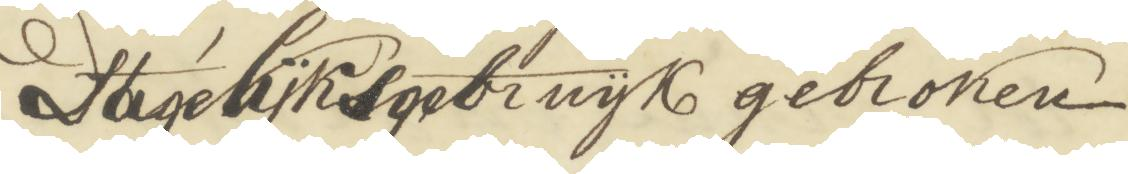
Dagelijksgebruijk gebroken
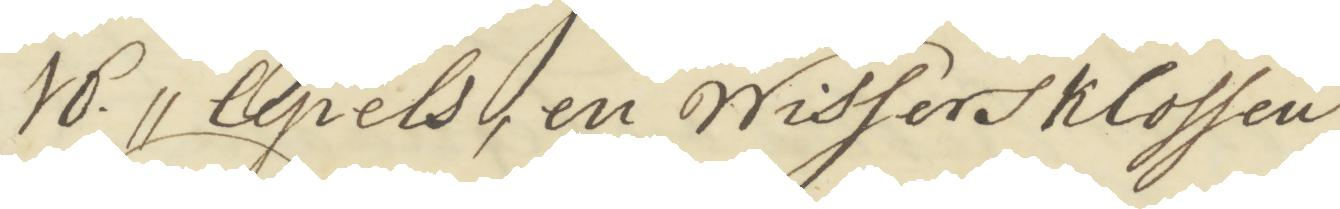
16. „ lepels, en wissersklossen
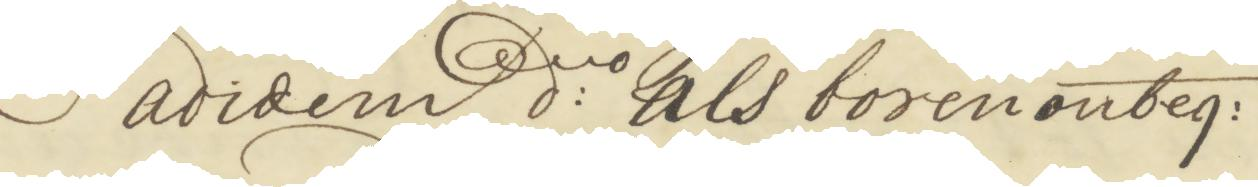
adidem d:o als boven onbeq:
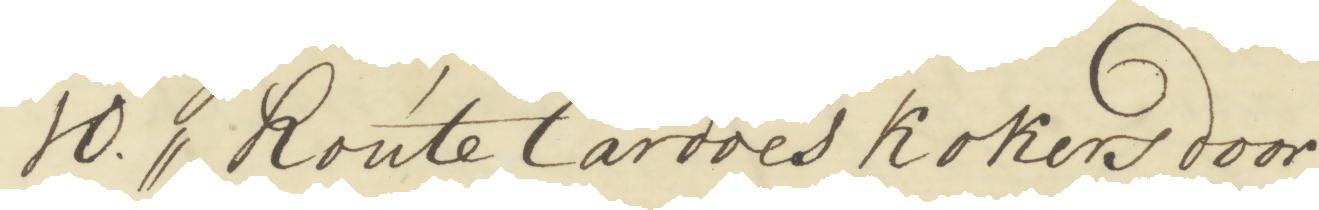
10. houte Cardoes kokers door
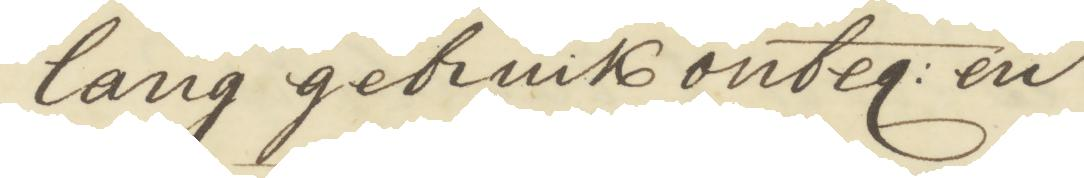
lang gebruik onbeq: en
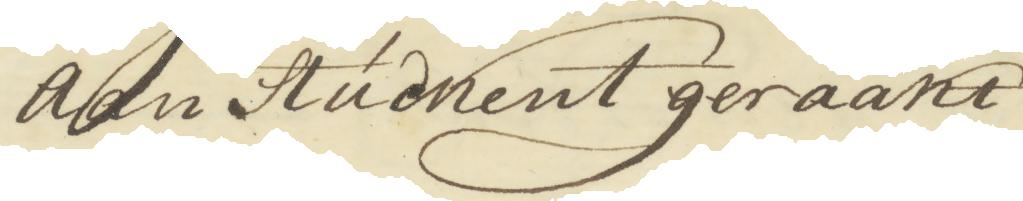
aan stuckent geraakt
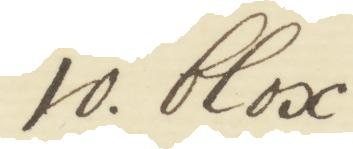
10. blox
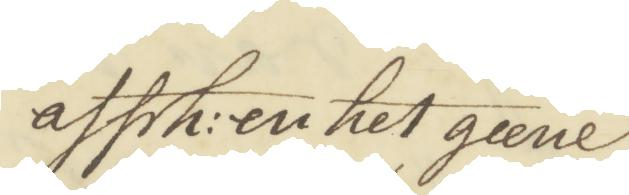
afsch: en het geene
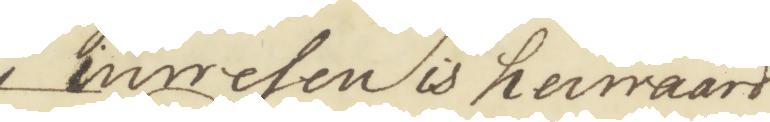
inwesen is herwaard
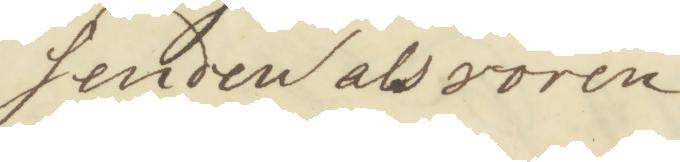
senden als voren
